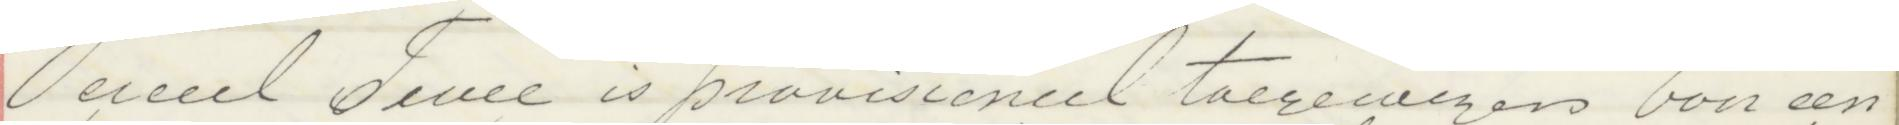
Perceel Twee is provisioneel toegewezen voor een
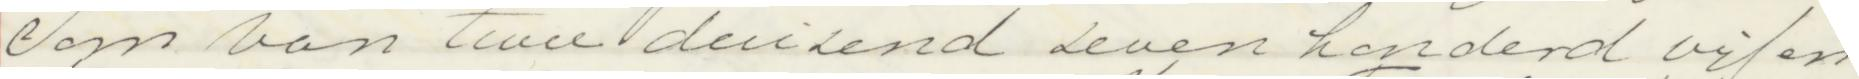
Som van twee duizend zeven honderd vijf en
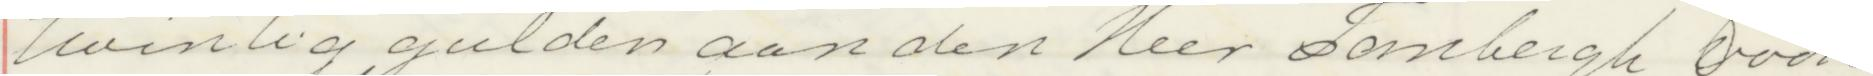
twintig gulden aan den Heer Tombergh voor-
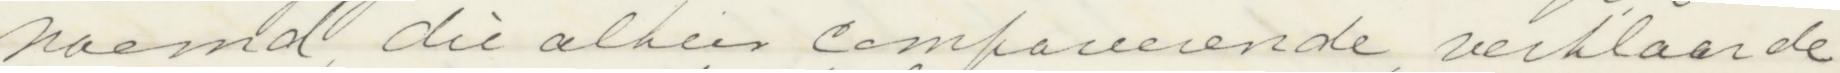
noemd, die alhier compareerende, verklaarde
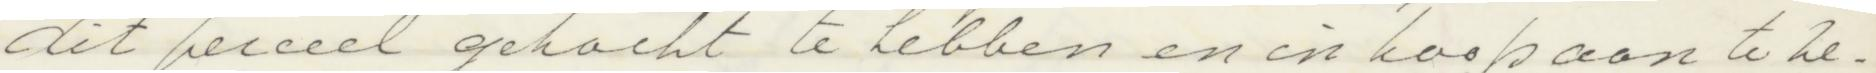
dit perceel gekocht te hebben en in koop aan te ne„
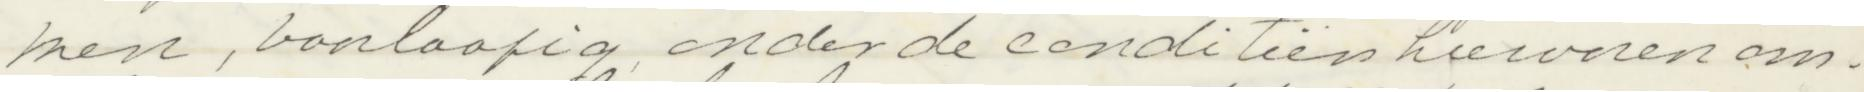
men, voorloopig, onder de conditiën hiervoren om.
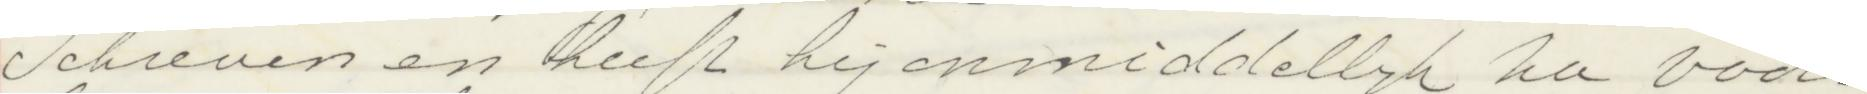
schreven en heeft hij onmiddellyk na voor-
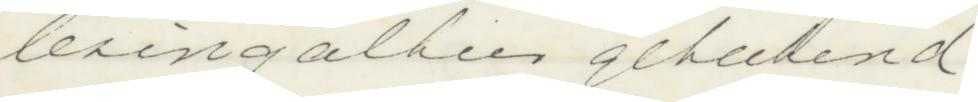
lezing alhier geteekend
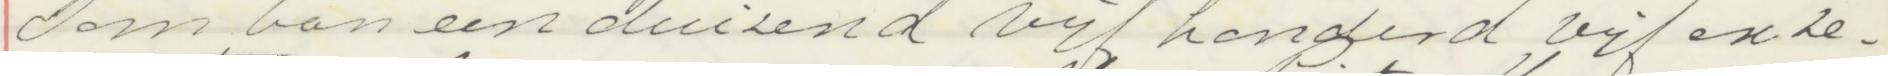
Som van een duizend vijf honderd vijf en ze-
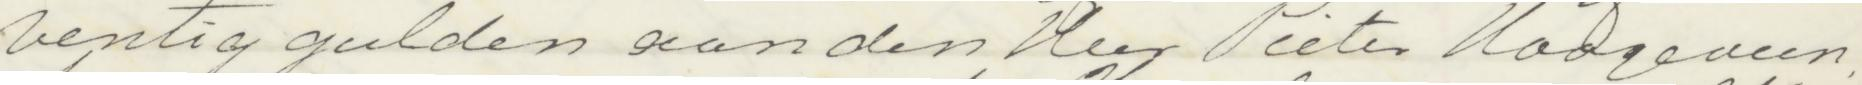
ventig gulden aan den Heer Pieter Hoogeveen,
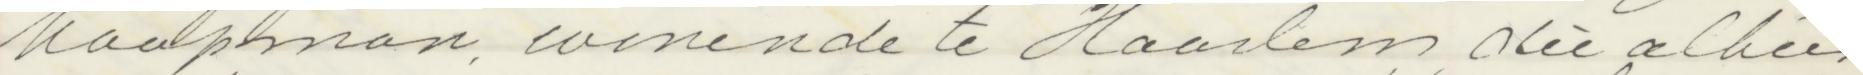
koopman, wonende te Haarlem, die alhier
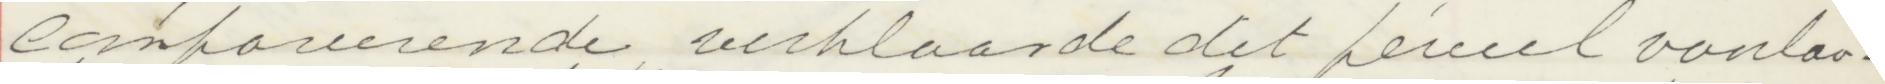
compareerende, verklaarde dit perceel voorloo-
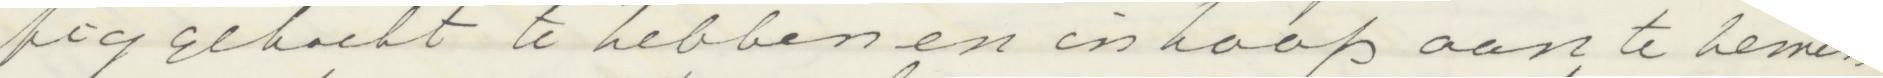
pig gekocht te hebben en in koop aan te nemen
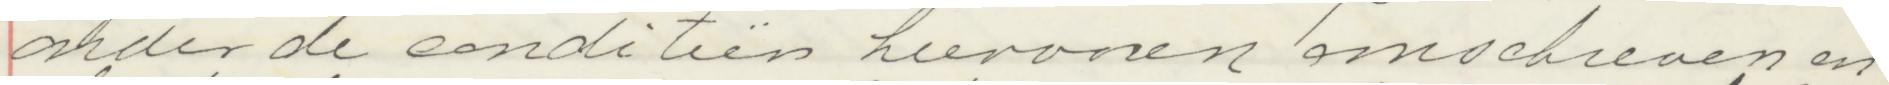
onder de conditiën hiervooren omschreven en
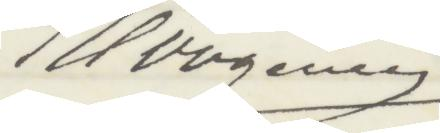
PHoogeveen
